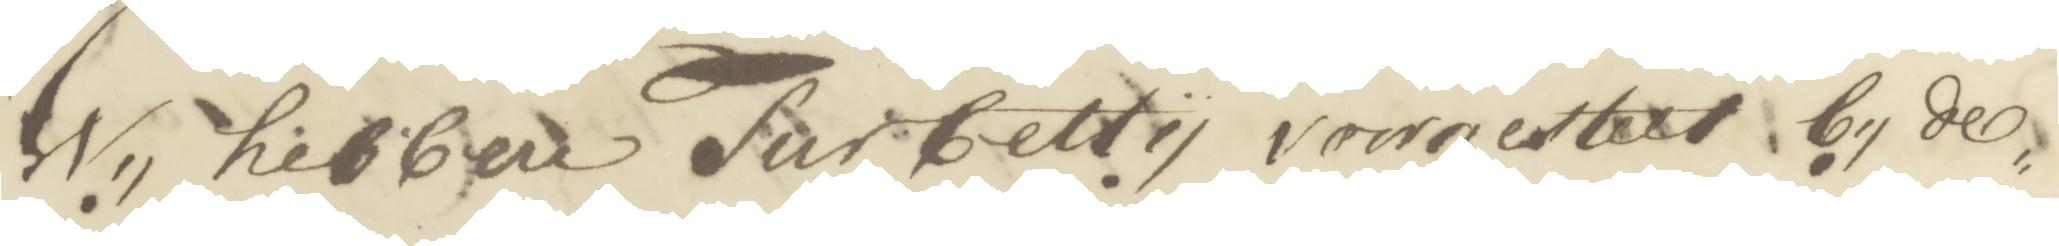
Wy hebben Turbettij voorgestelt by de„
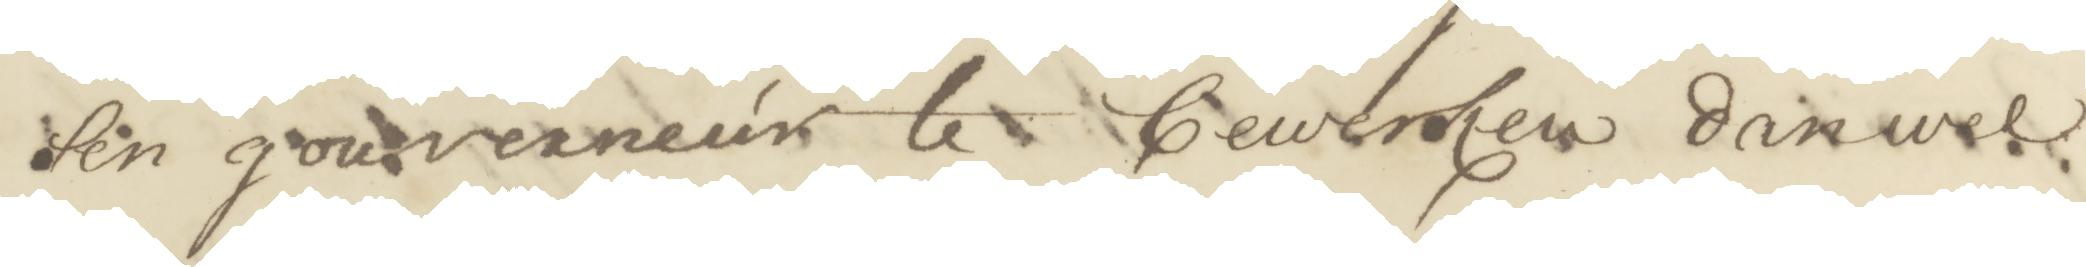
sen gouverneur te bewerken dan wel
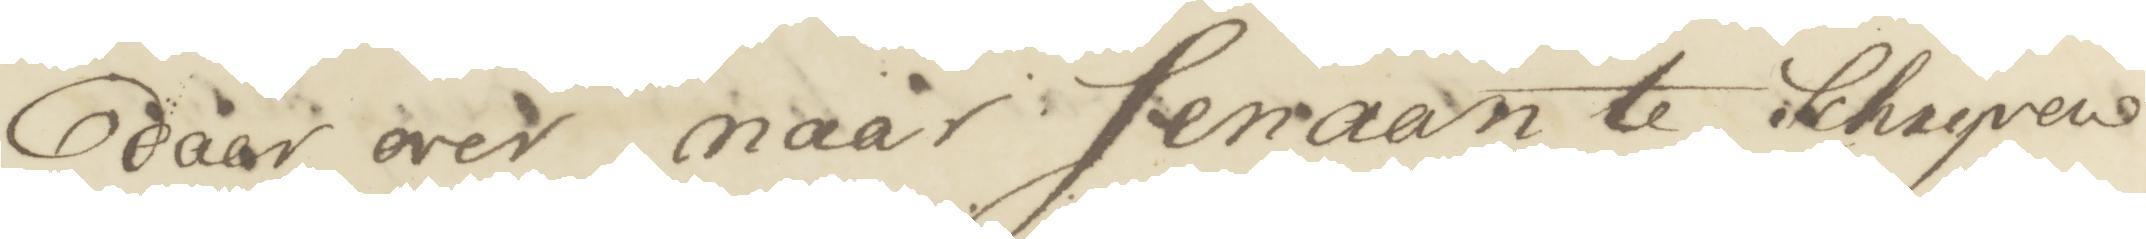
daar over naar senaan te schryven
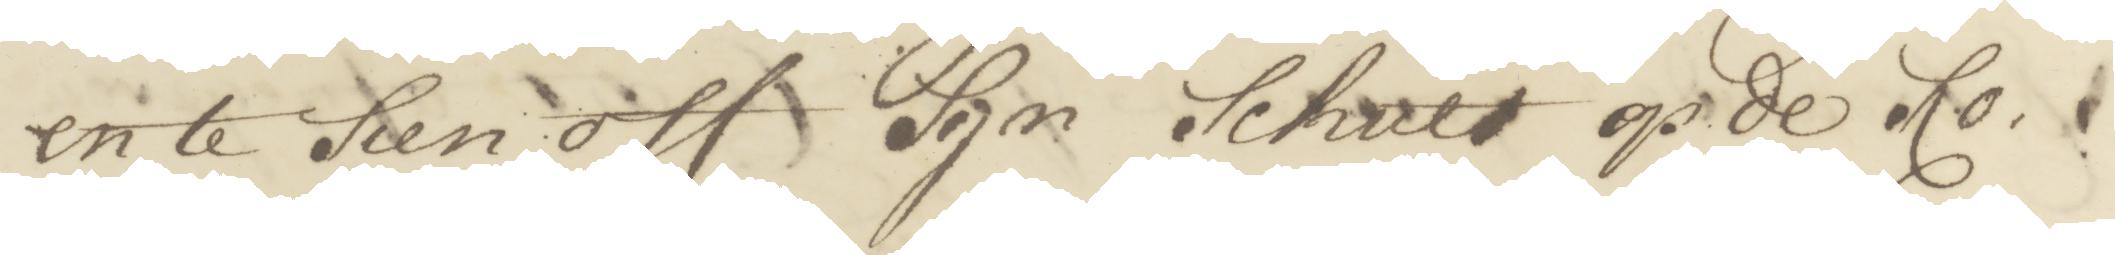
en te sien off syn schult op de Ko,
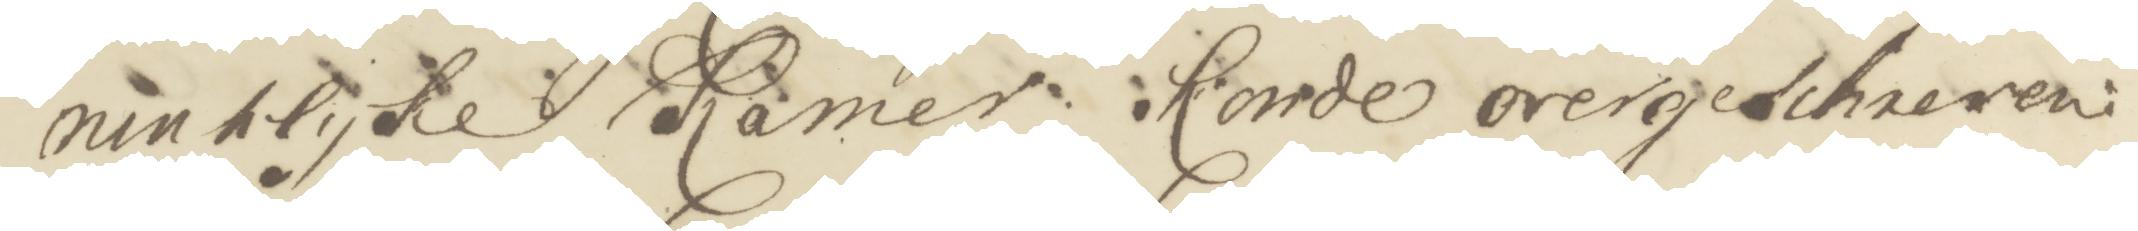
ninklyke Kamer konde overgeschreven:
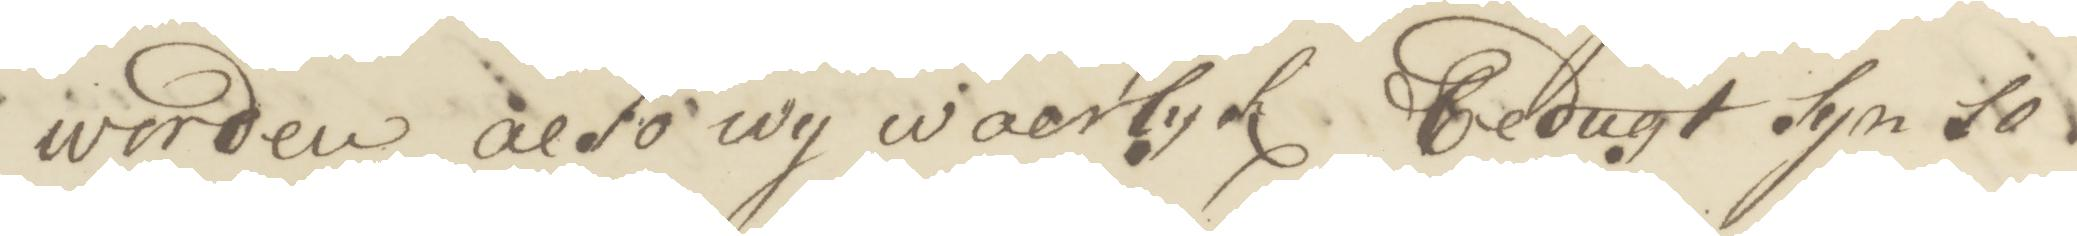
worden also wy waerlyk bedagt syn so
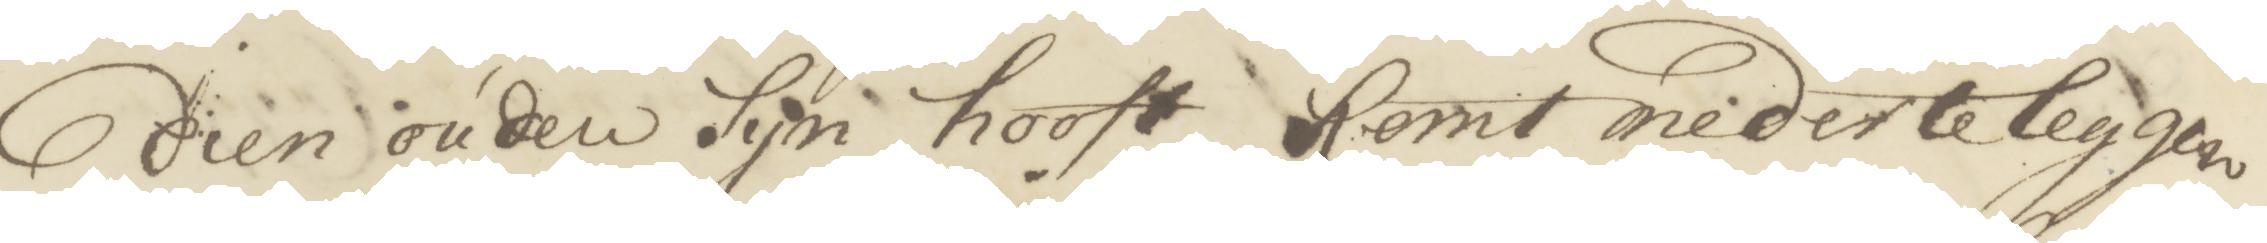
dien ouden syn hooft komt neder te leggen
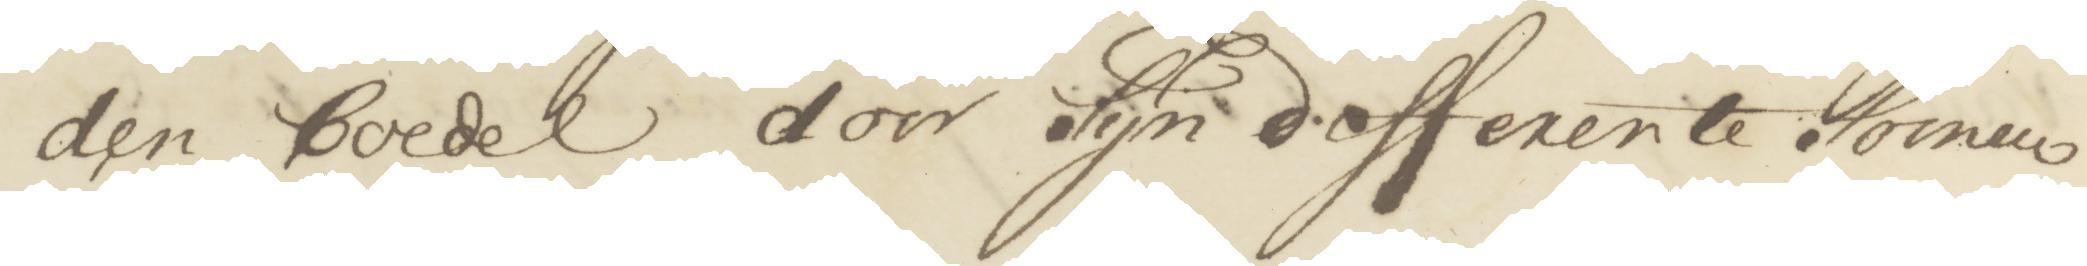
den boedel door syn d offeren te somer
